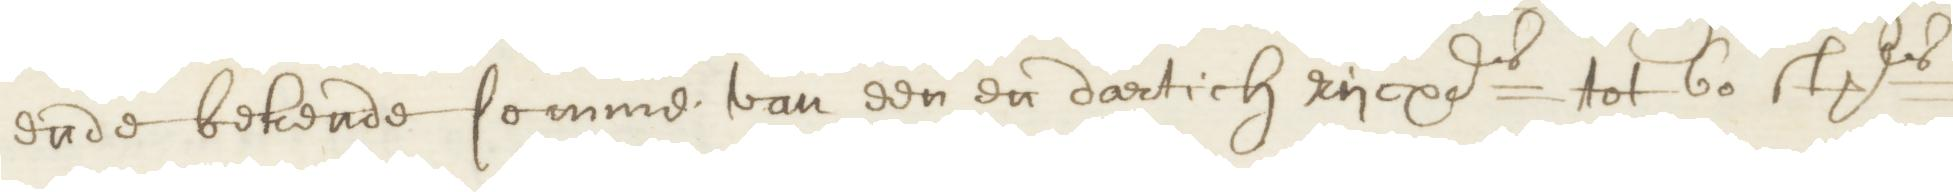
ende bekende somme van een en dartich rijcxd=s tot 60 stver=s
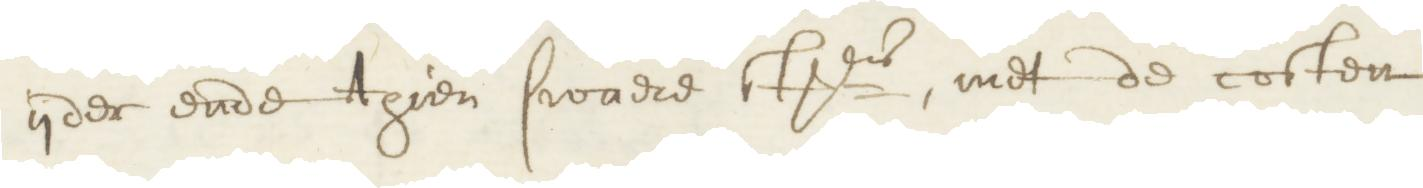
ijder ende thien swaere stver=s, met de costen
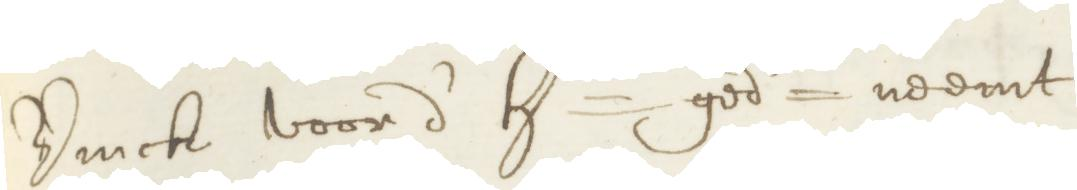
Vinck voor d’ h=ren ged=ens neemt
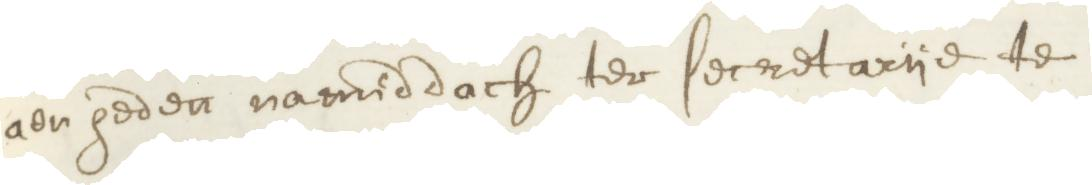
aen heden namiddach ter secretarije te
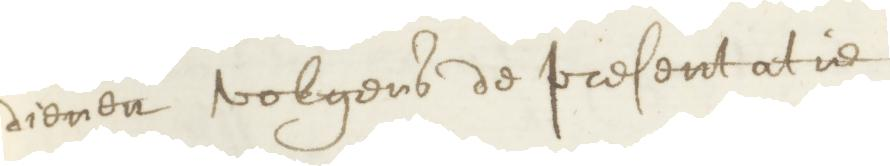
dienen volgens de presentatie
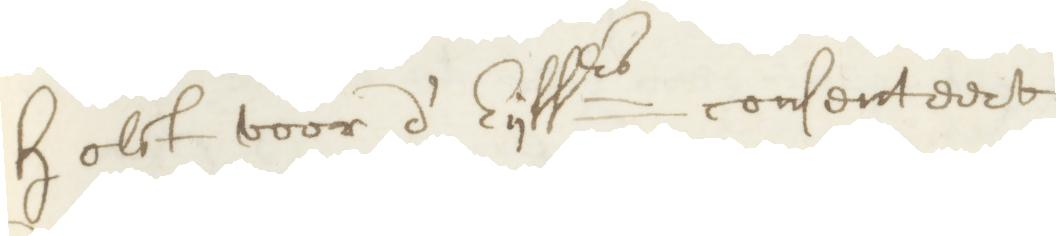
Holst voor d’ Eijss=rs consenteert
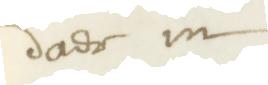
daer in
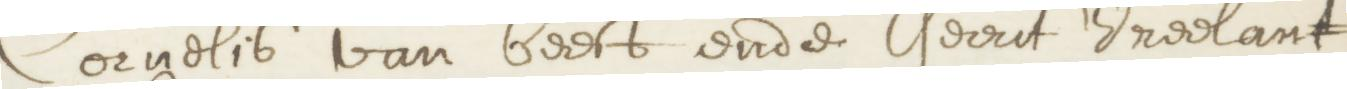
Cornelis van beest ende Gerrit Vreelant
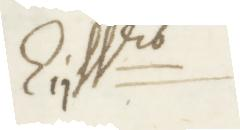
Eijss=rs
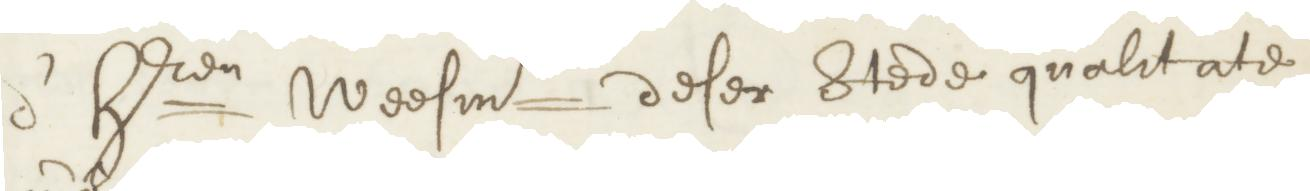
d' h=ren weesm=ren deser stede qualitate
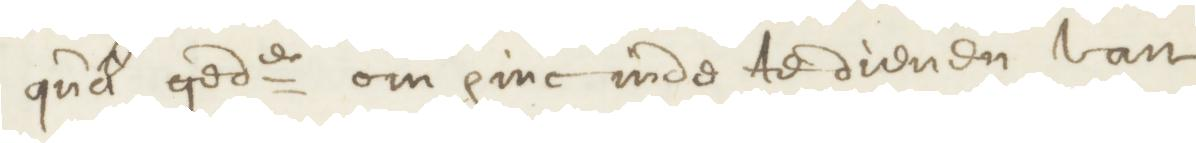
quâ ged=e om hinc in de te dienen van
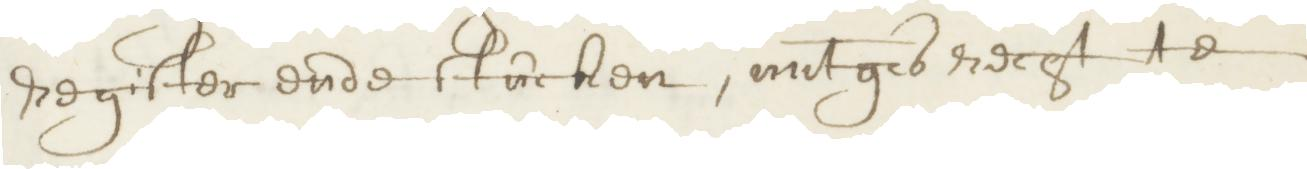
register ende stucken, mitgrs recht te
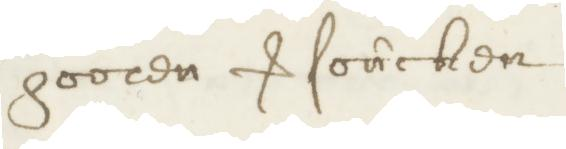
hooren versoucken
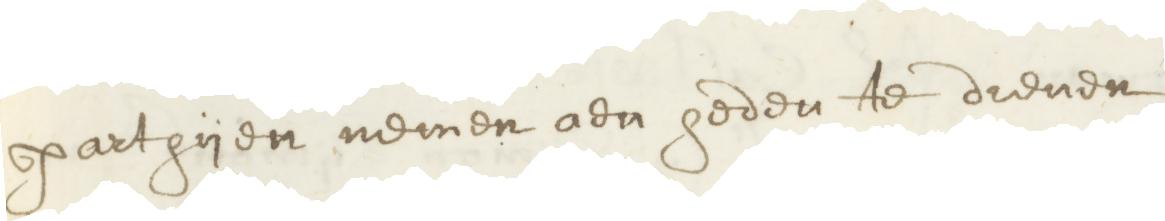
parthijen nemen aen heden te dienen
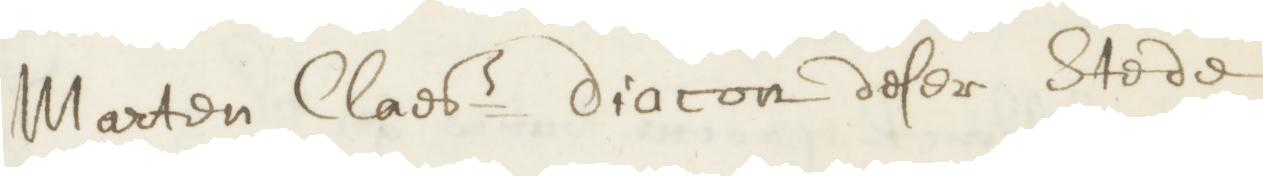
Marten Claes=z diacon deser stede
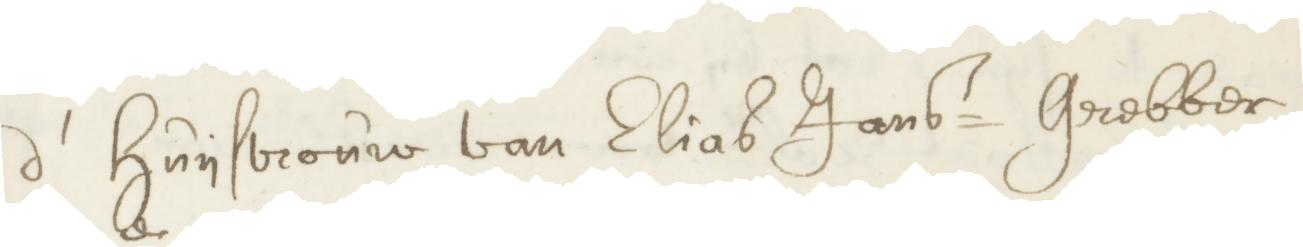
d’ huijsvrouw van Elias Jans=z Grebber
